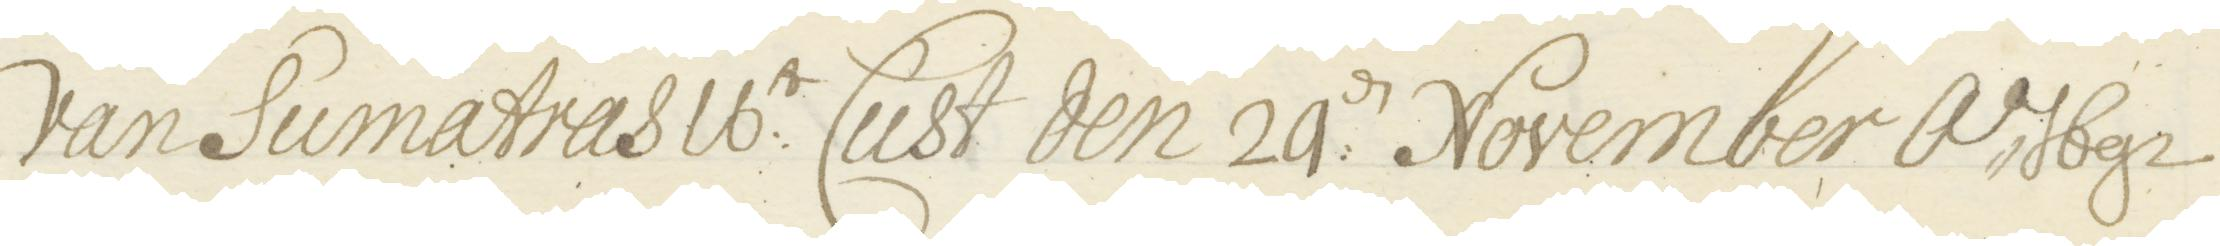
Van Sumatras w:t Cust den 24:en November A„o 1692
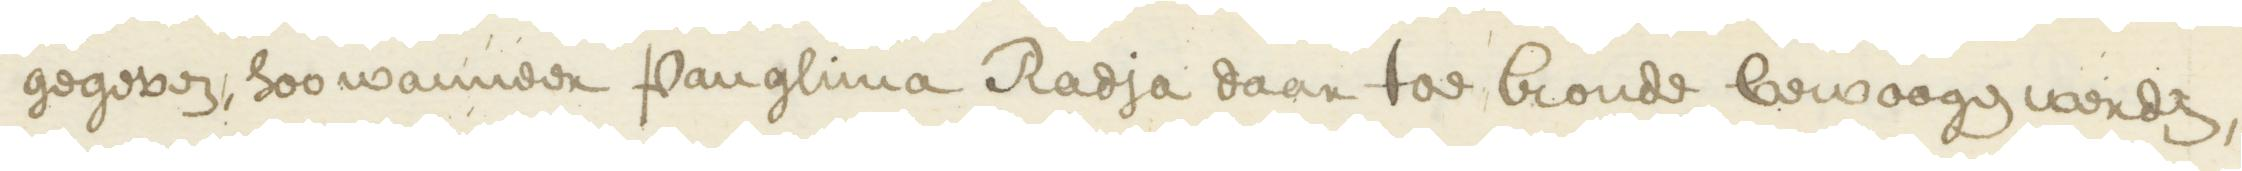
gegeven, soo wanneer Panglima Radja daar toe konde bewoogen werden
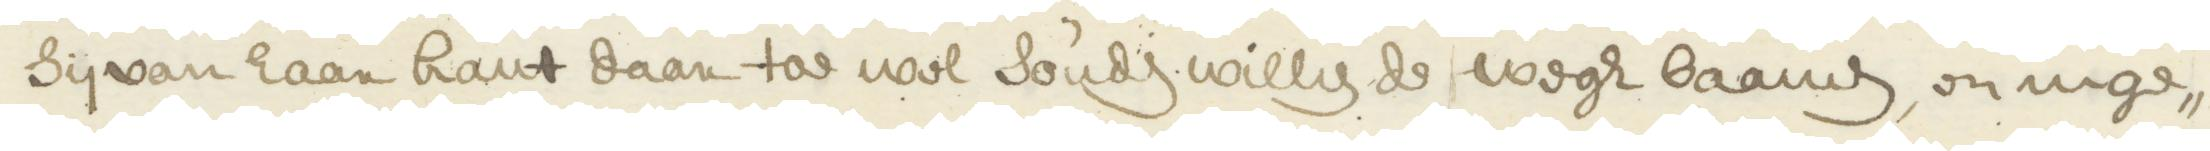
sij van haar kant daar toe wel souden willen de wegh baanen, en inge„
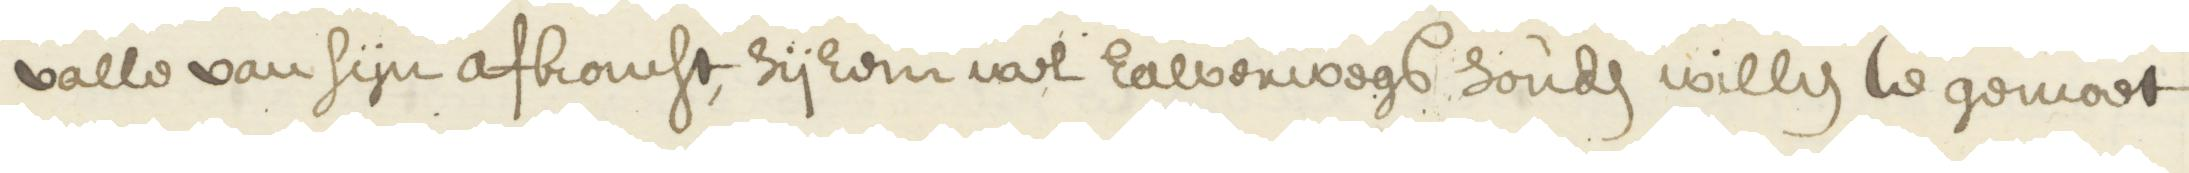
valle van sijn afkomst, sij hem wel halverwegs souden willen te gemoet
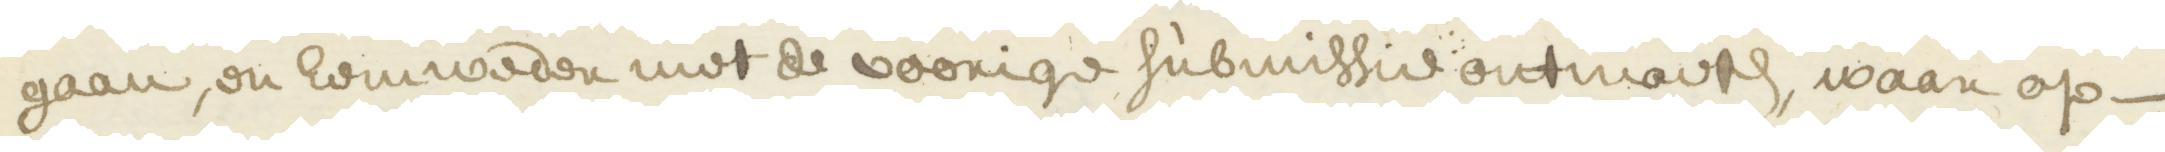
gaan, en hem weder met de voorige submissie ontmoeten, waar op
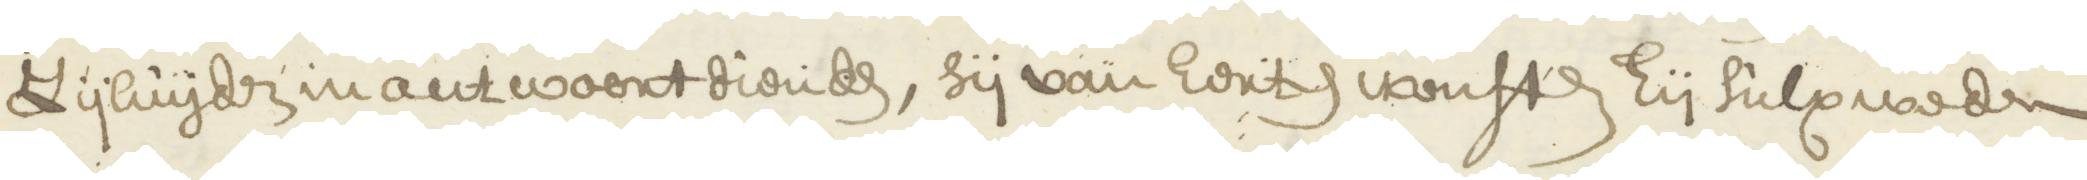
zij luijden in antwoort dienden, sij van herten wensten hij sulx weder
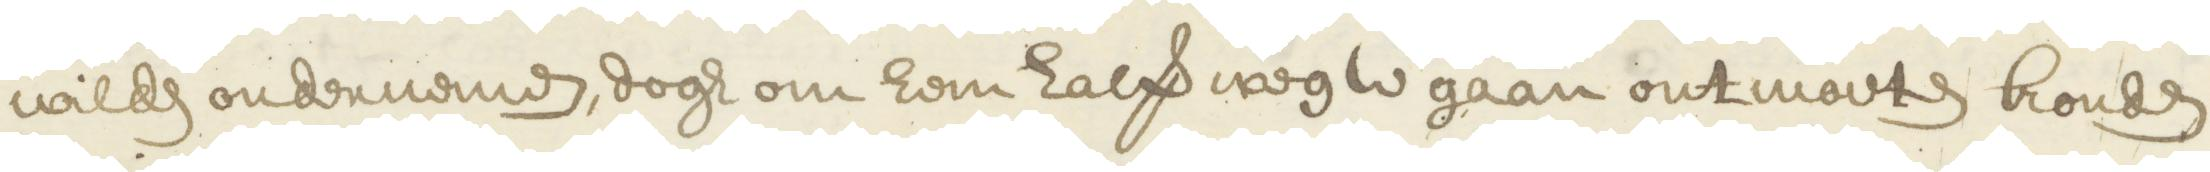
wilden ondernemen, dogh om hem halver weg te gaan ontmoeten konden
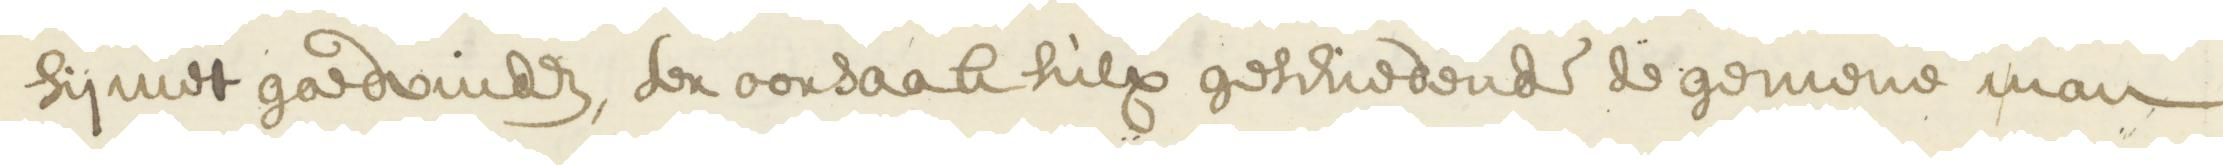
sij niet goedvinden, ter oorsaak sulx geschiedende de gemene man
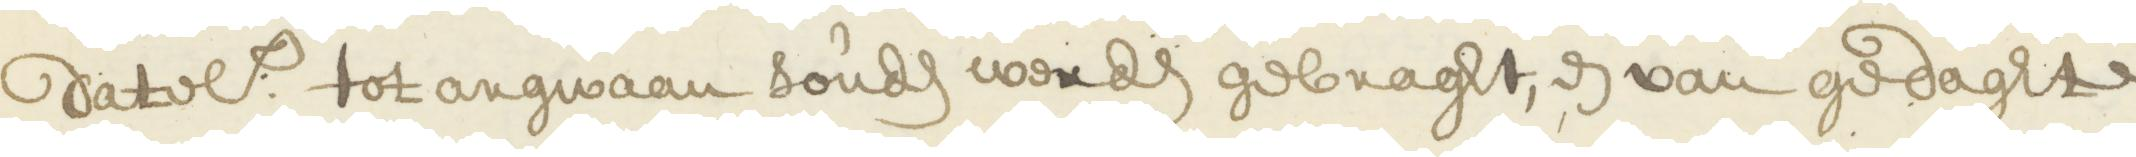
datelijk tot argwaan souden werden gebraght, en van gedaghten
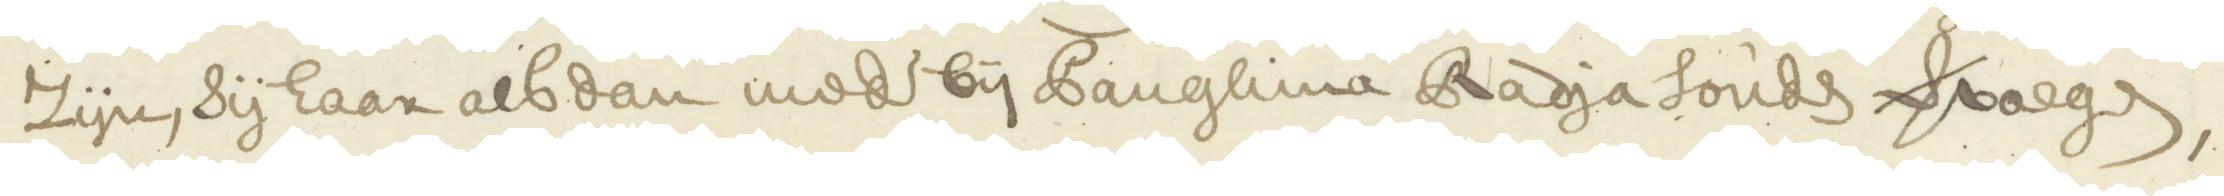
zijn, sij haar als dan mede bij Panglima Radja souden vervoegen,
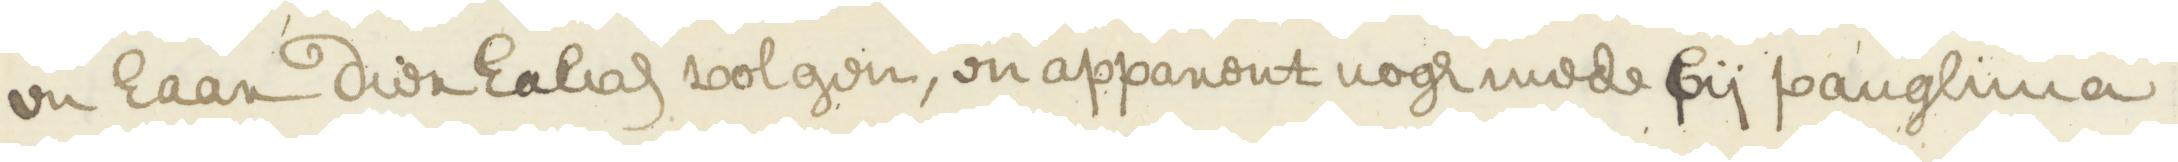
en haar dier halven volgen, en apparent nogh mede bij panglima
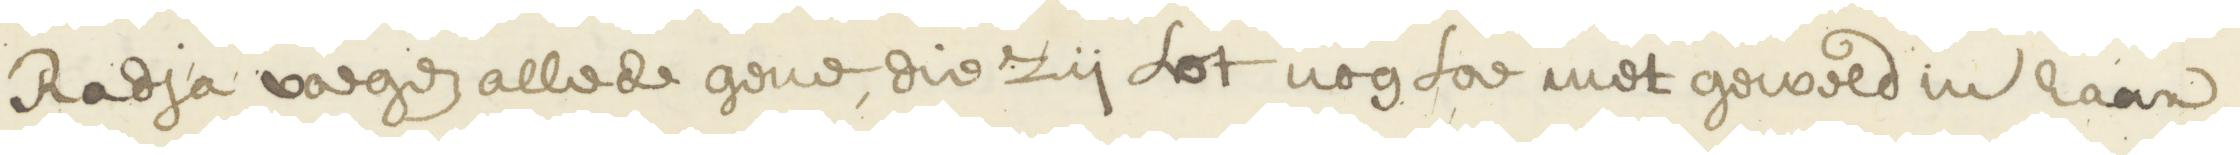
Radja wegen alle de gene, die zij tot nog toe met geweld in haar
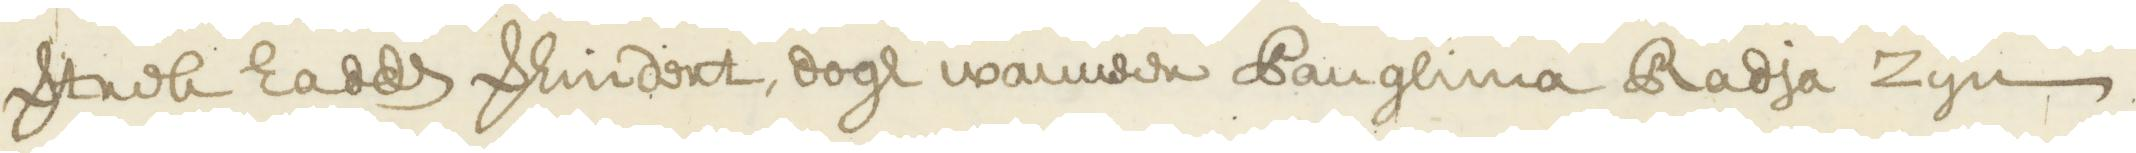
vertrek hadden verhindert, dogh wanneer Panglima Radja zijn
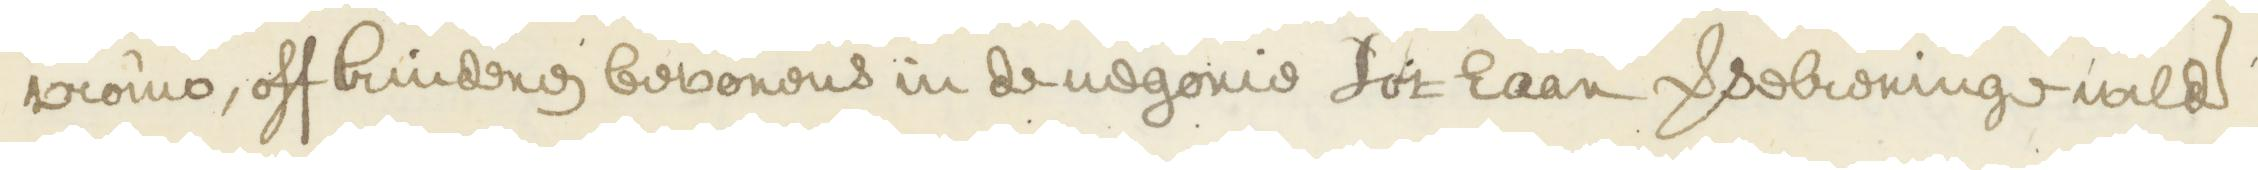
vrouw, off kinderen bevorens in de negorie tot haar versekeringe wilde
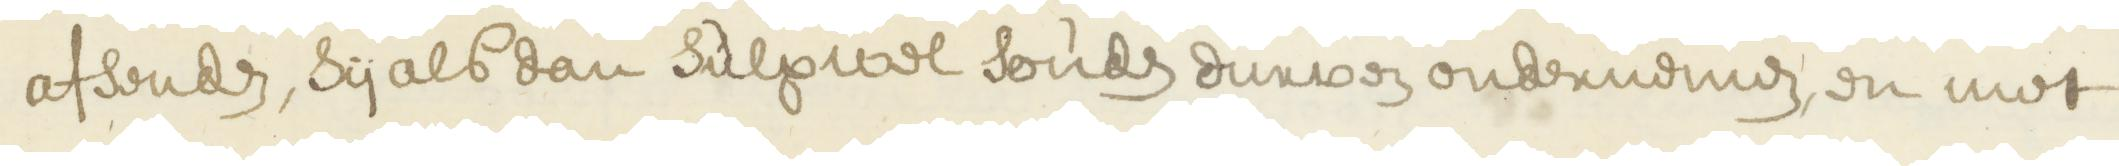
afsenden, sij als dan sulx wel souden durven ondernemen, en met
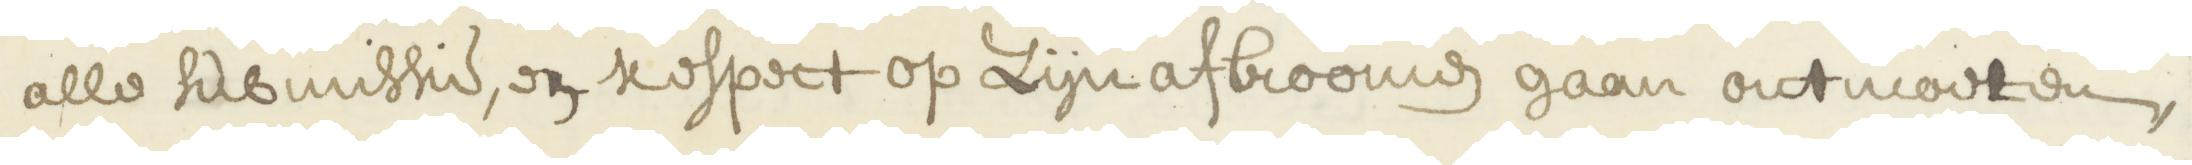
alle submissie, en respect op zijn afkoomen gaan ontmoeten,
